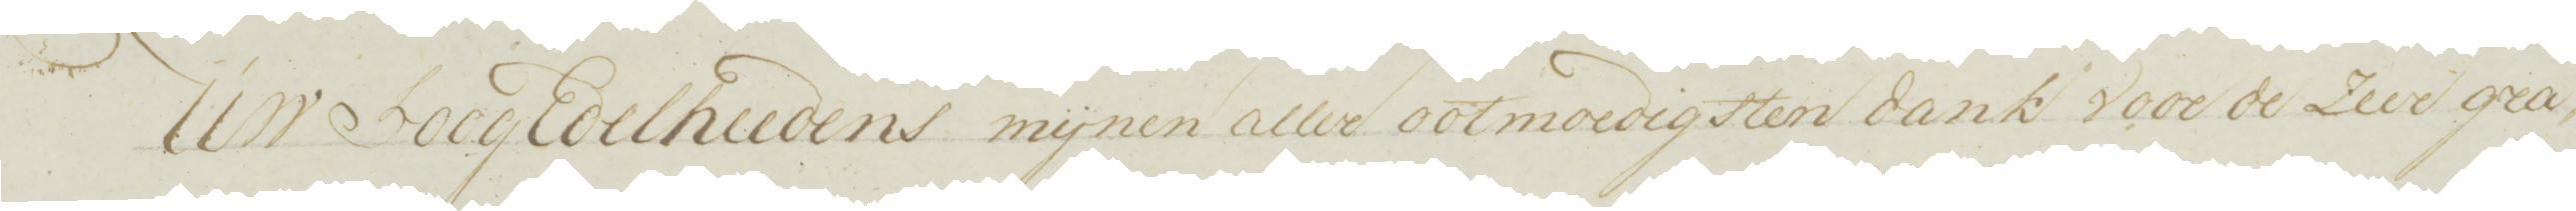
UW Hoog Edelheedens mijnen aller ootmoedigsten dank voor de zeer gra„
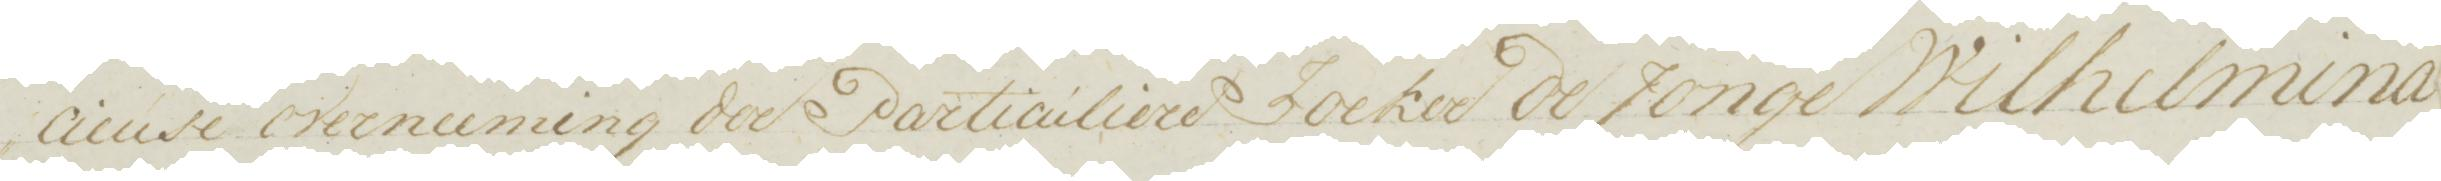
„cieuse overneeming der Particuliere hoeker de Jonge Wilhelmina
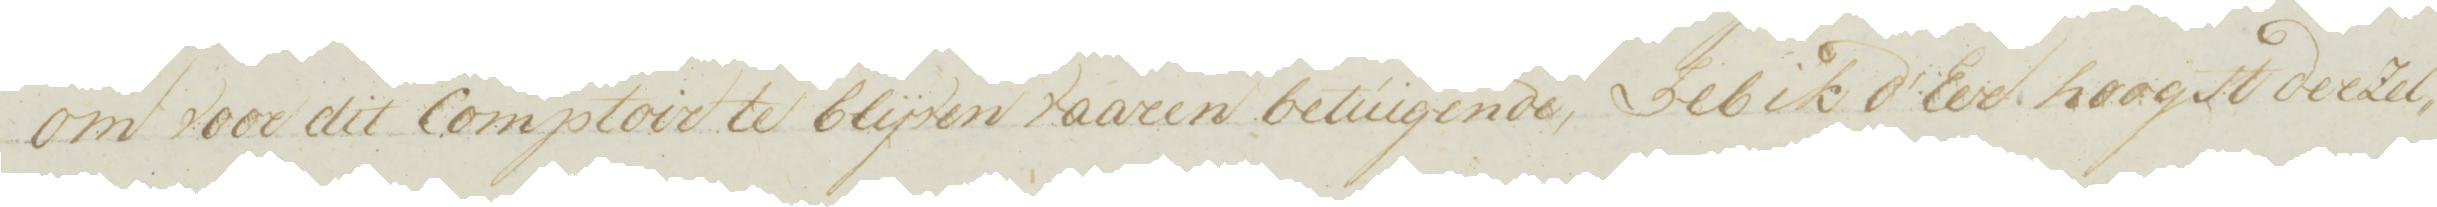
om voor dit Comptoir te blijven vaaren betuigende, heb ik d’ Eer hoogst derzel„
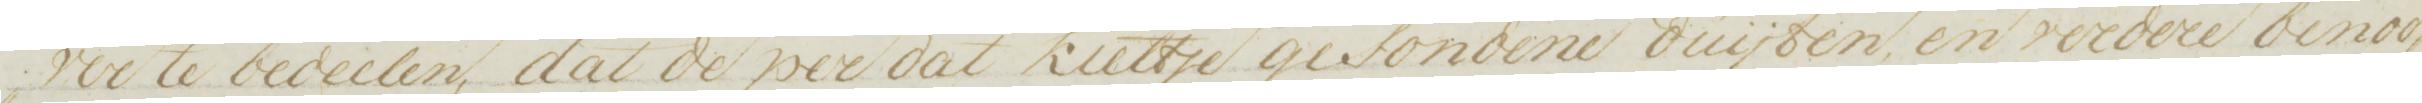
„ver te bedeelen, dat de per dat kiettje gesondene duijten, en verdere benoo
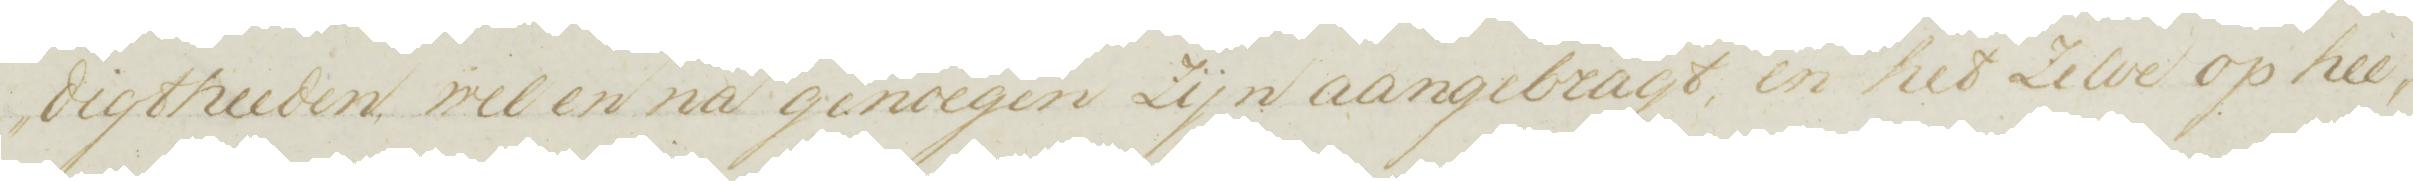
„digtheeden wel en na genoegen Zijn aangebragt, en het zelve op hee„
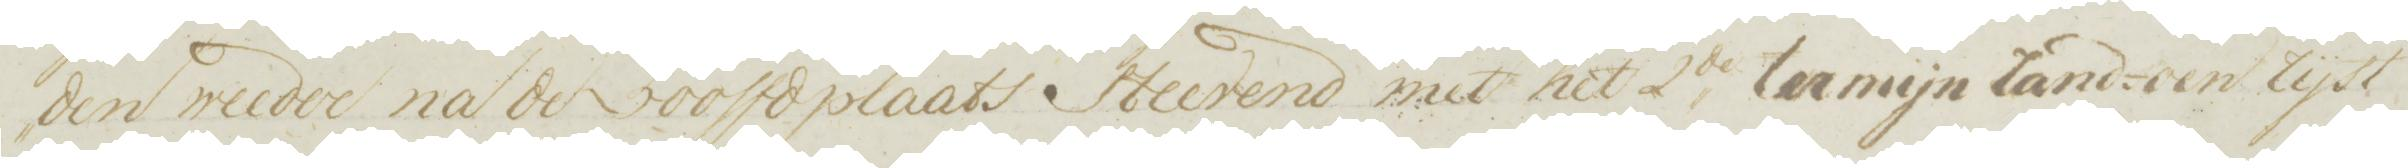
„den weeder na de hooffdplaats Steevend met het 2„de termijn Randsoen rijst
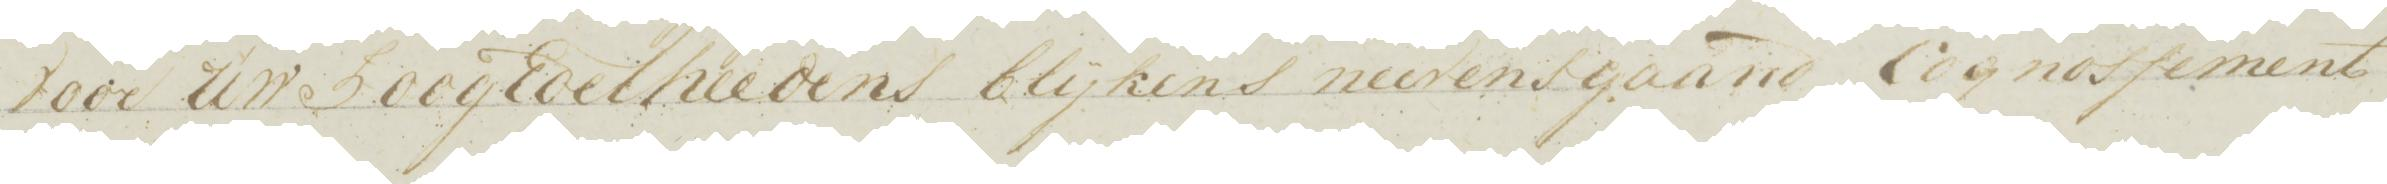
Voor Uw hoog Edelheedens blijkens neevens gaand Cognossement
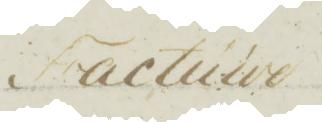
Factuur
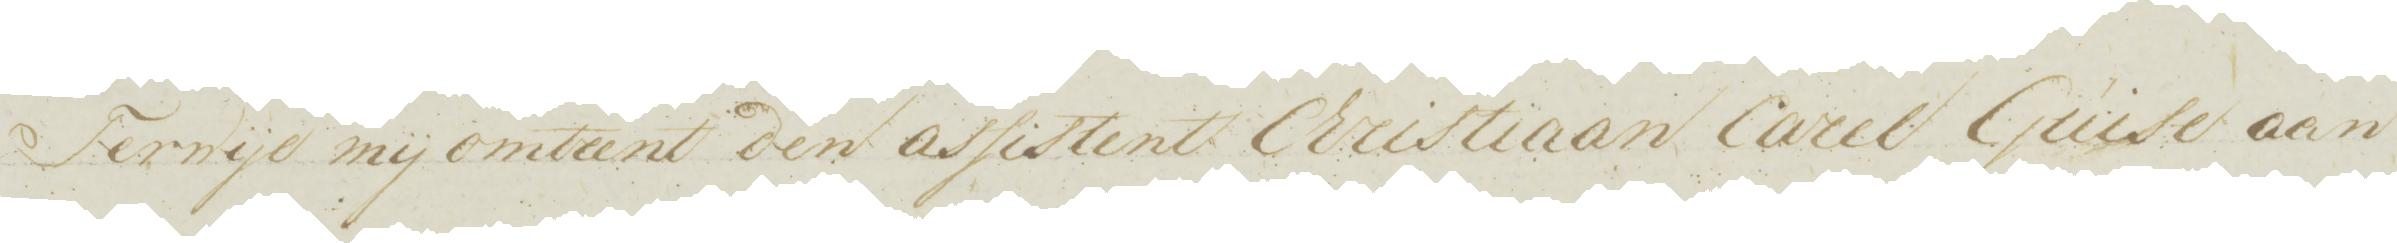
Terwijl mij omtrent den assistent Christiaan Carel Guise aan
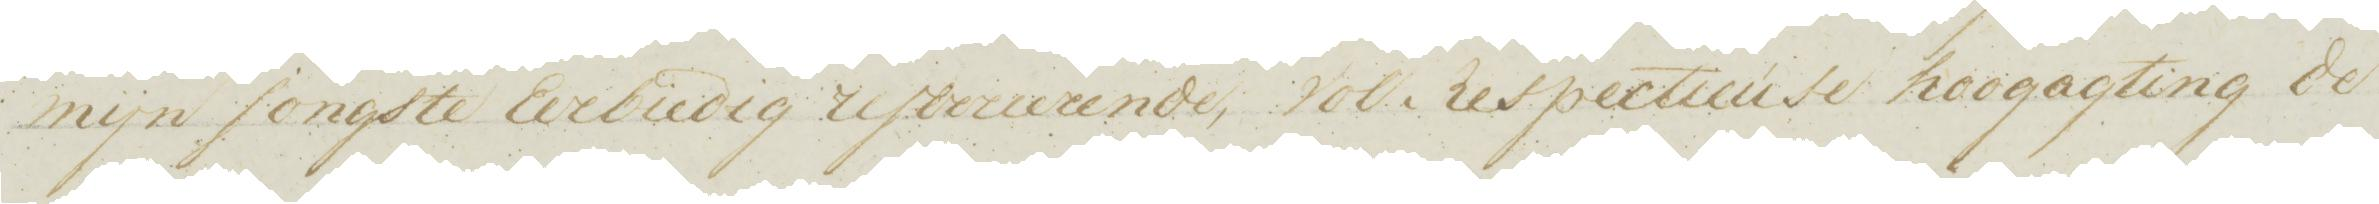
mijn Jongste Eerbiedig referreerende, vol Respectieuse hoogagting de
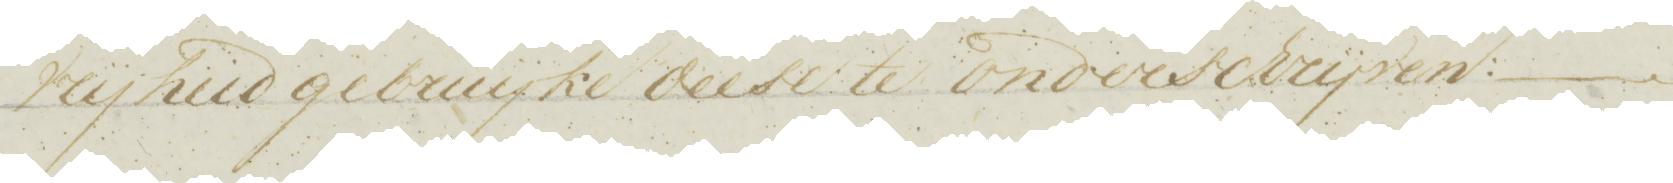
vrijheid gebruijke deese te onderschrijven: —
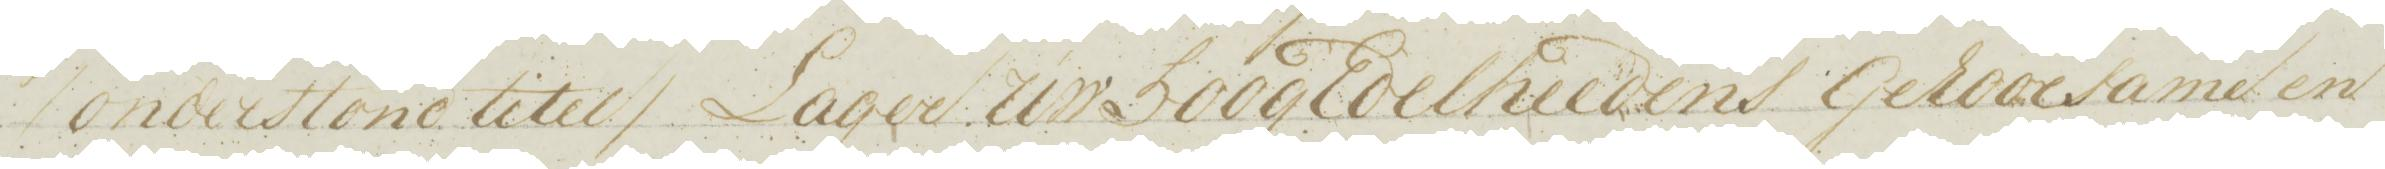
/onderstond titel/ Lager uw Hoog Edelheedens Gehoorsame en
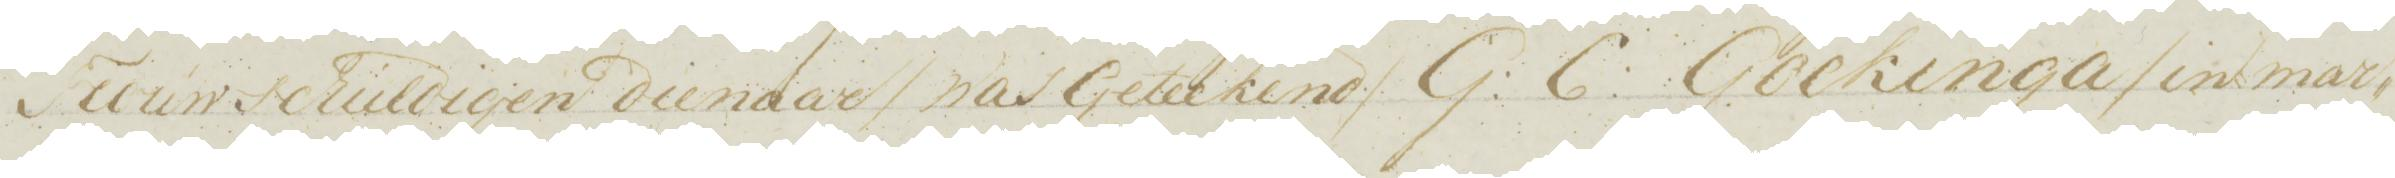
Trouw schuldigen dienaar /was Geteekend:/ G: C: Goekinga /in mar„
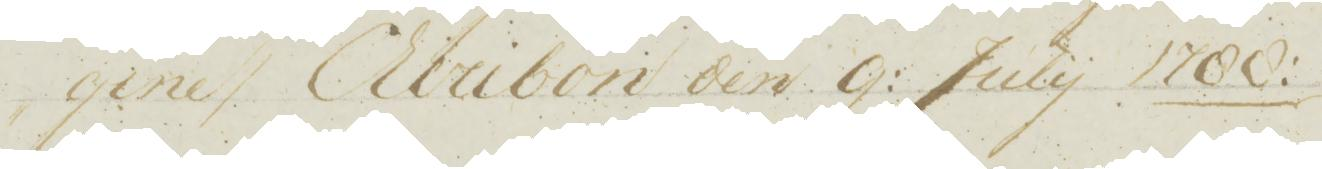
„gine/ Cheribon den 9: Julij 1788:
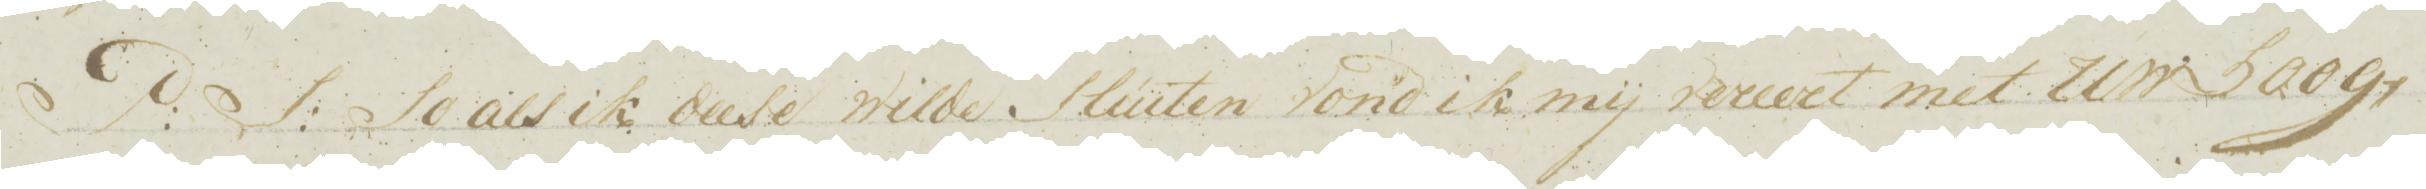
P:S: So als ik deese wilde Sluiten vond ik mij vereert met UW Hoog„
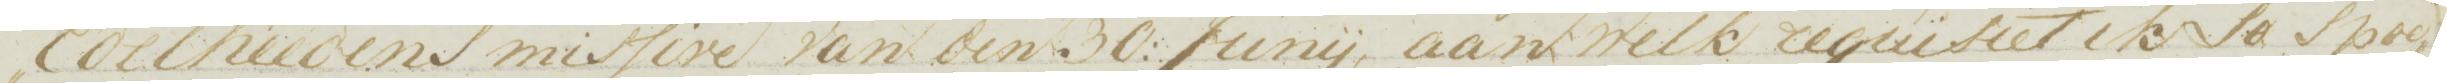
Edelheedens missive van den 30: Junij, aan welk requisiet ik So Spoe„
